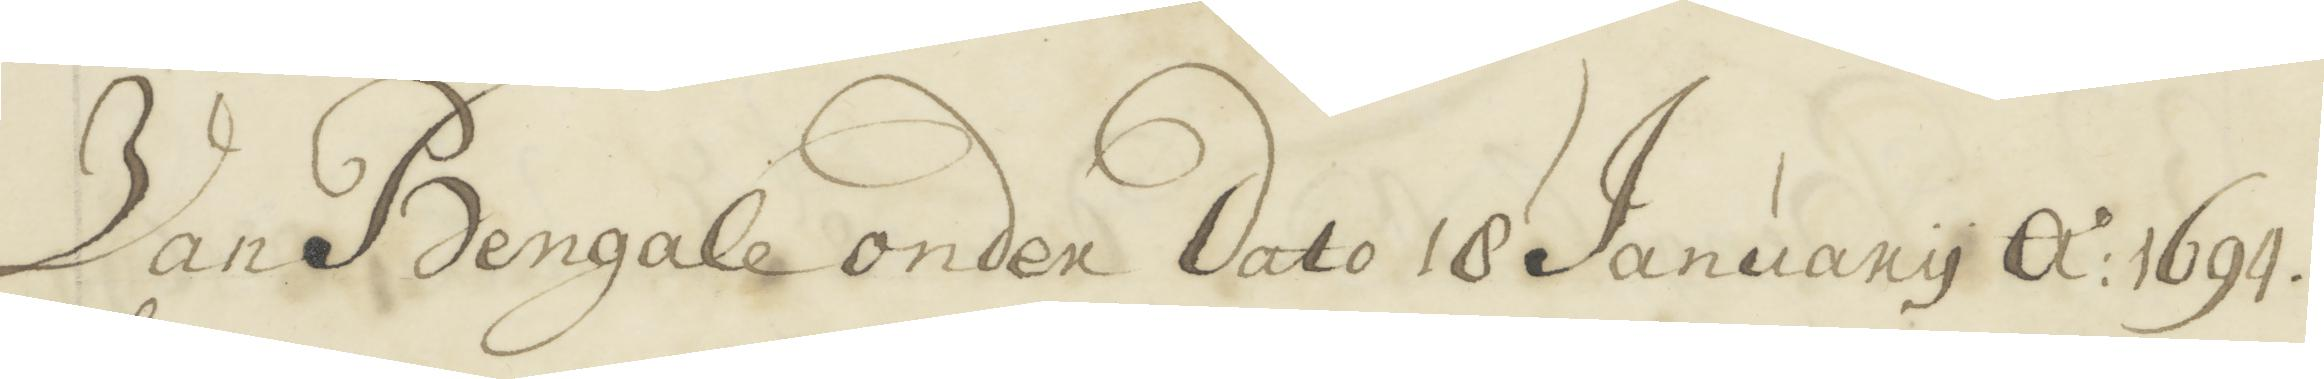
Van Bengale onder dato 18' Ianuarij A:o 1694.
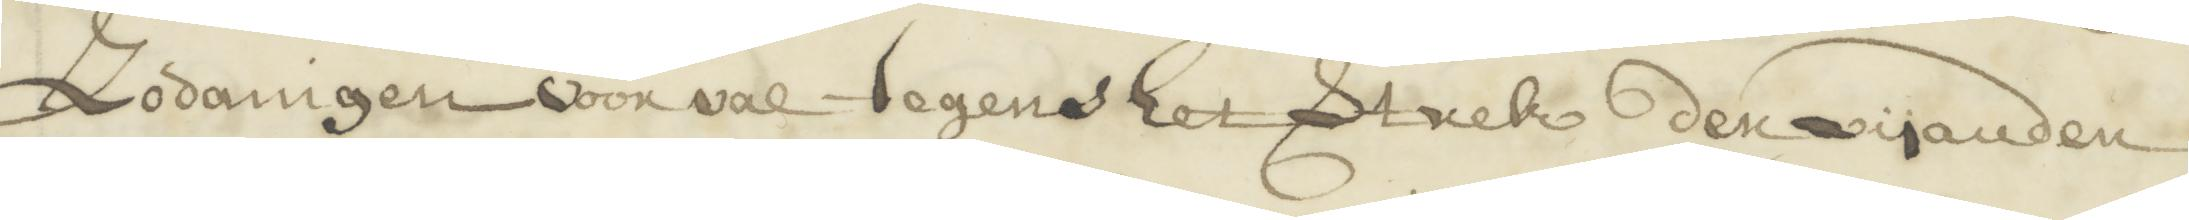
Zodanigen voorval tegens het vertrek der vijanden
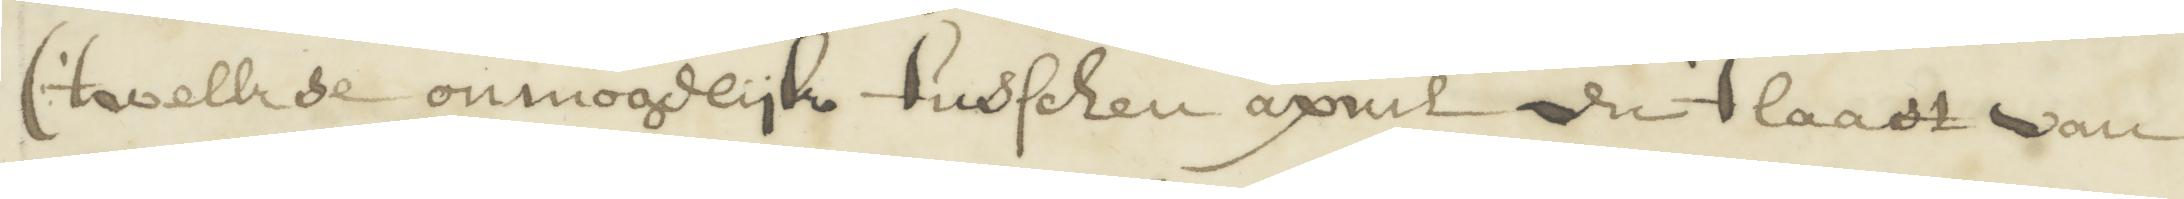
(:'twelk se onmogelijk tusschen april en 'tlaast van
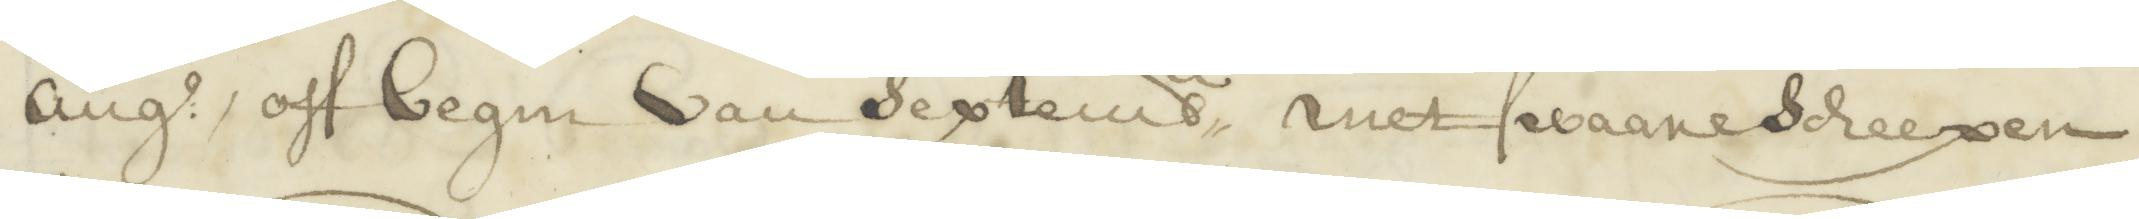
aug:o, off begin van septemb„r met swaare scheepen
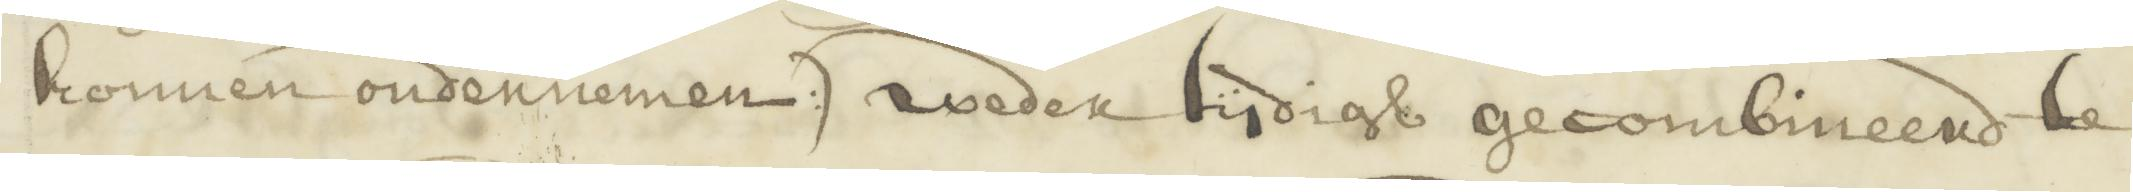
konnen ondernemen:) weder tijdigh gecombineerd te
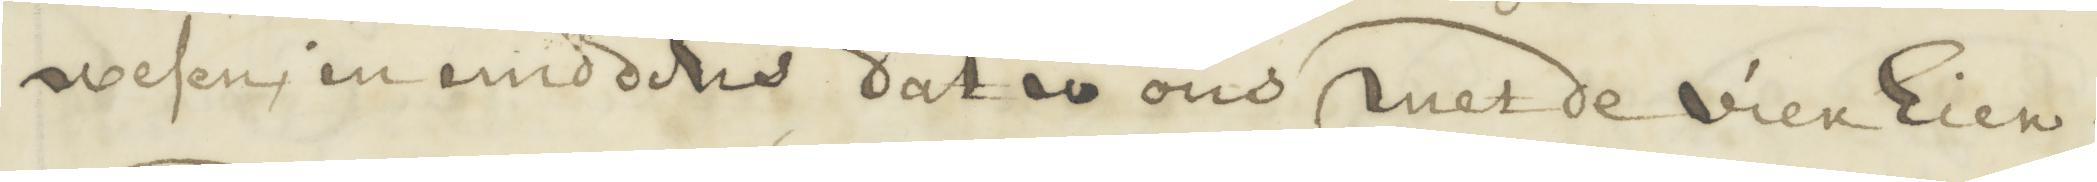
wesen, inmiddels dat w' ons met de vier hier
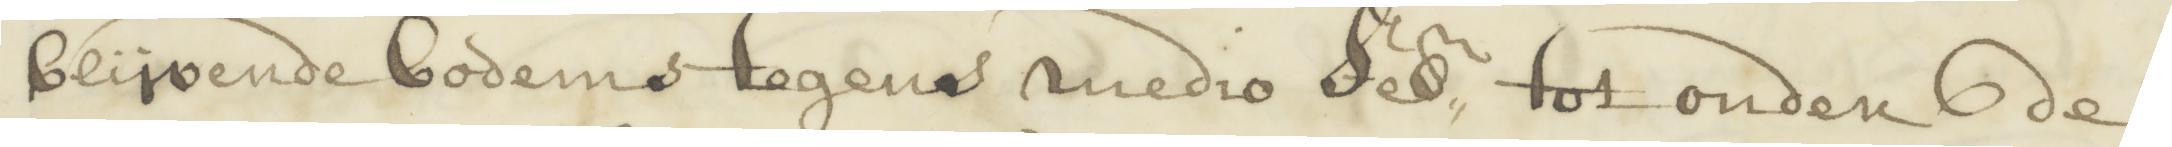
blijvende bodems tegens medio Sep„r tot onder de
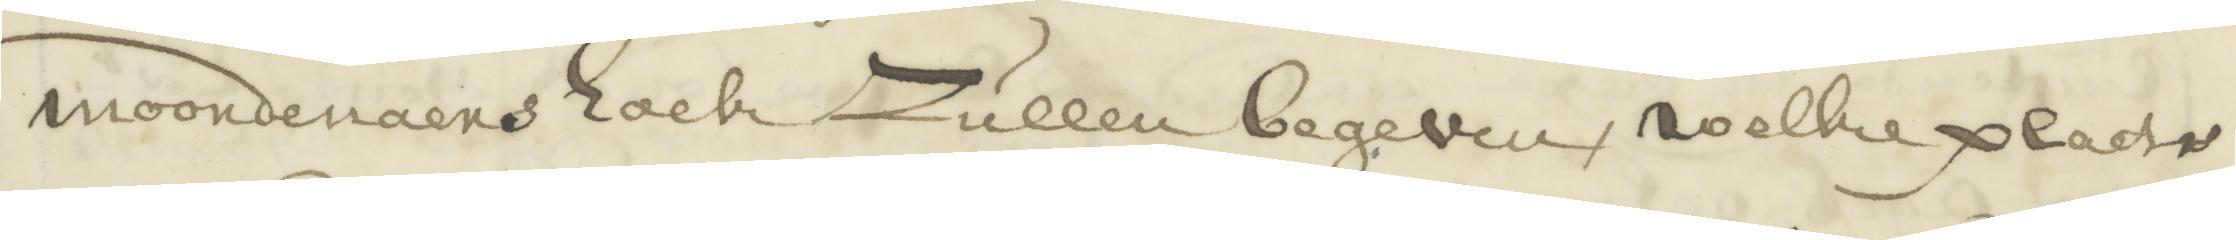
moordenaers hoek Zullen begeven, welke plaets
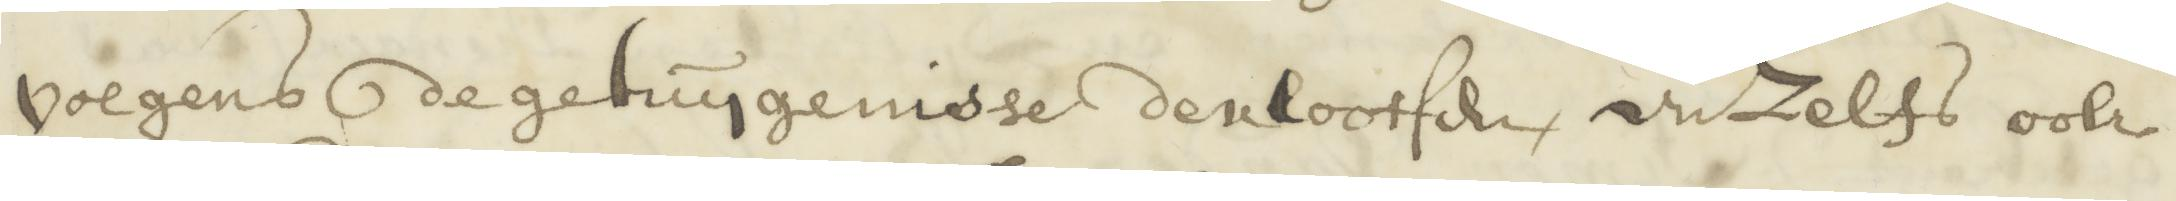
volgens de getuijgenisse derlootsen, enzelfs ook
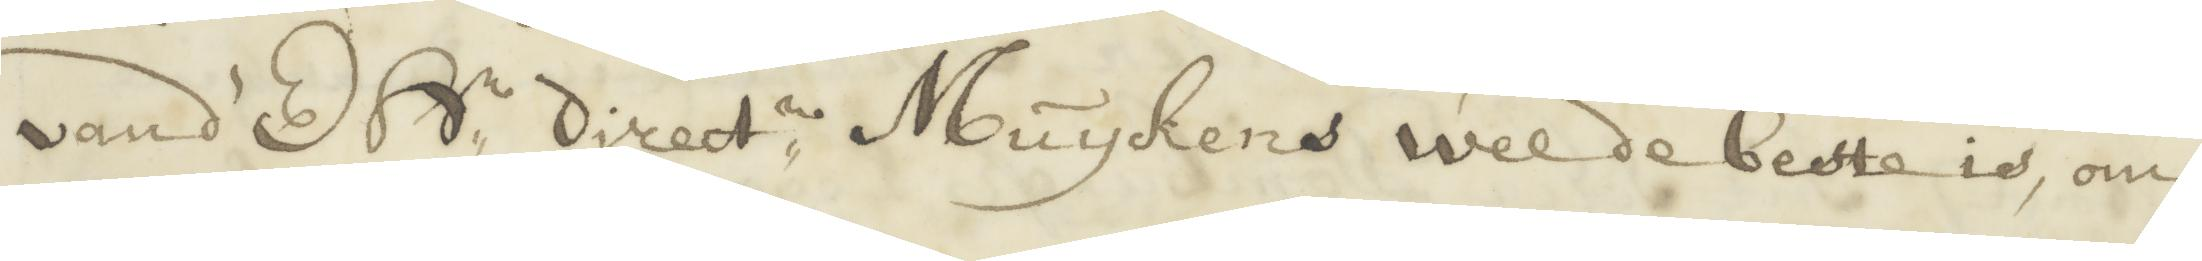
van d’ E H„r direct„r Muijkens wel de beste is, om
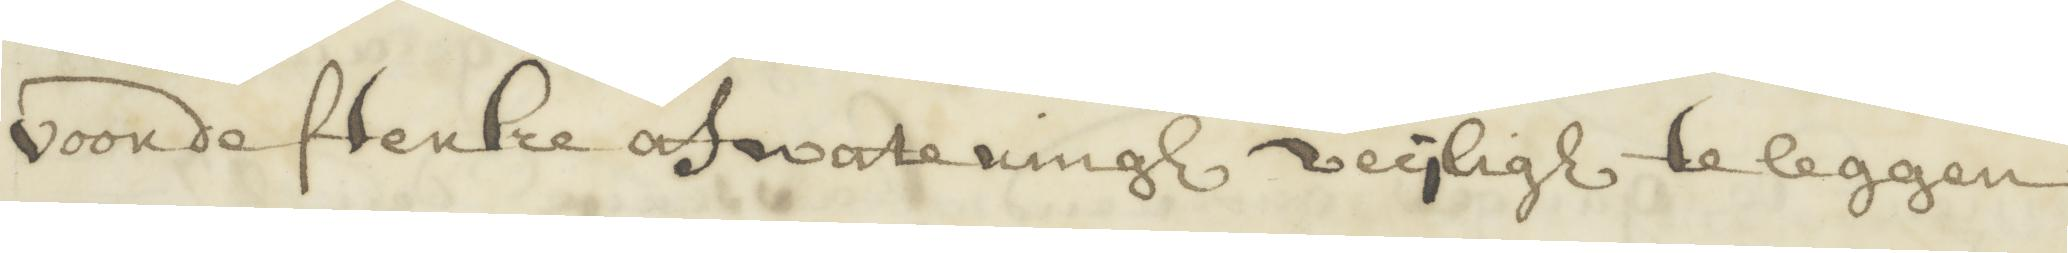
voor de sterke afwateringh veijligh te leggen.
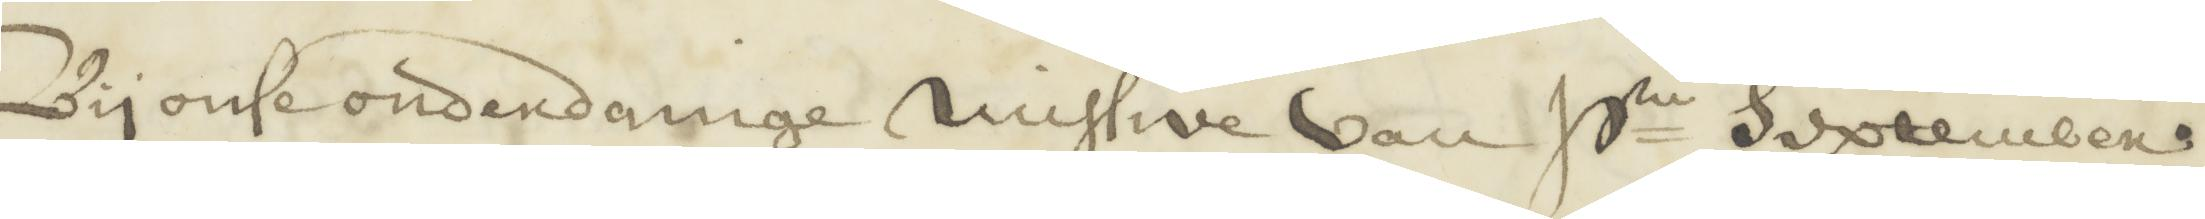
Bij onse onderdanige missive van Jd=m September
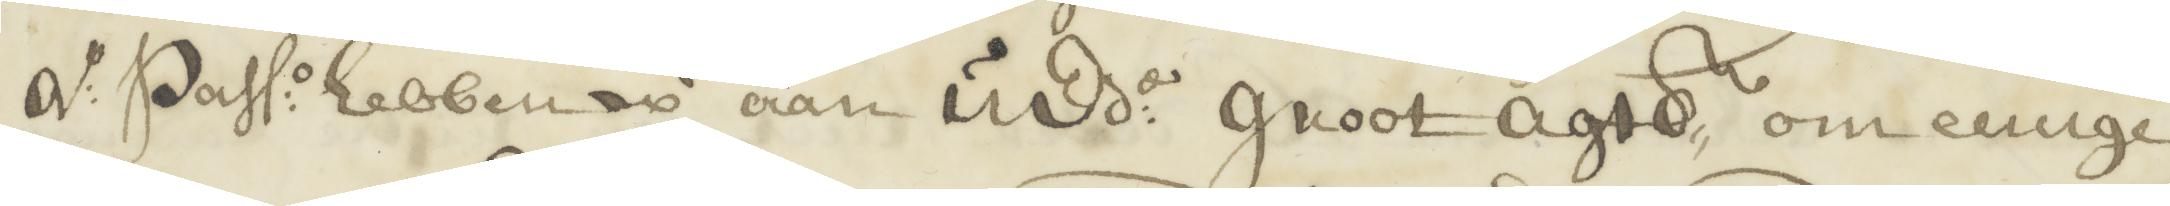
A:o Pass:o hebben w' aan UEd:e groot agtb„e om eenige
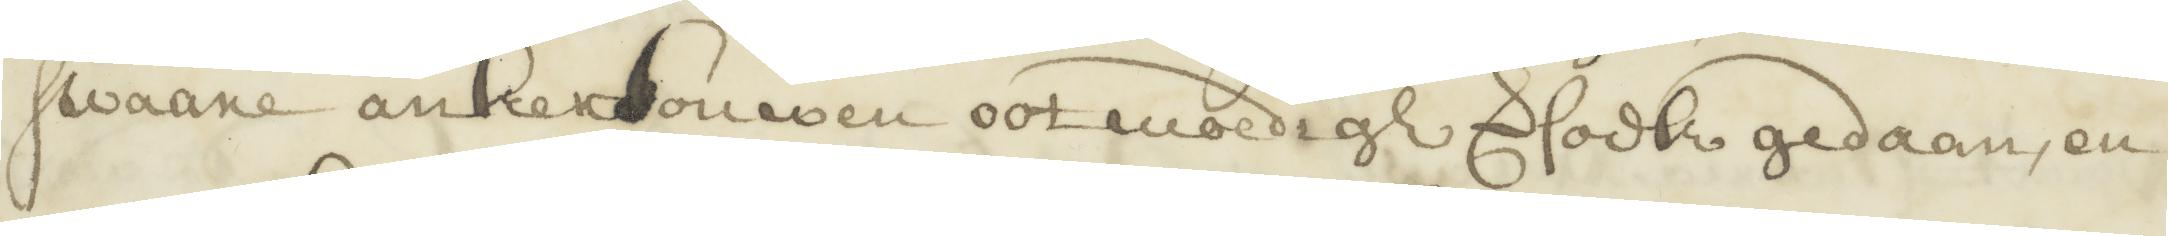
swaare ankertouwen ootmoedigh versoek gedaan, en
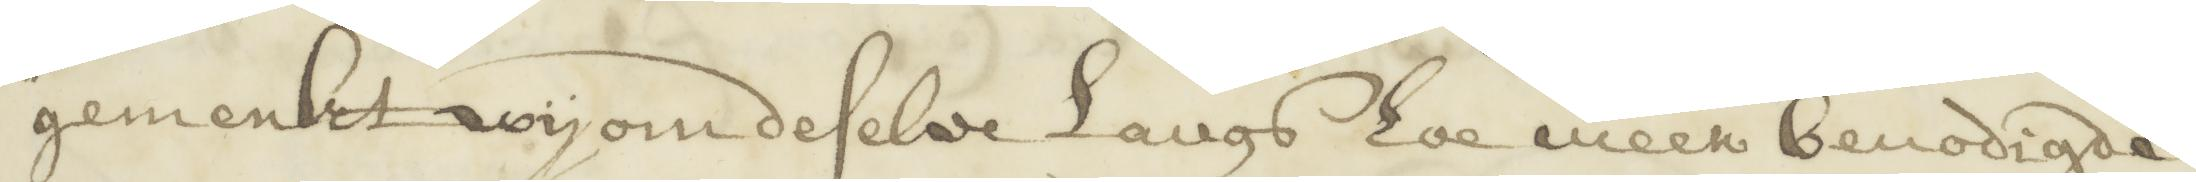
gemerkt wij om deselve langs hoe meer benodigde
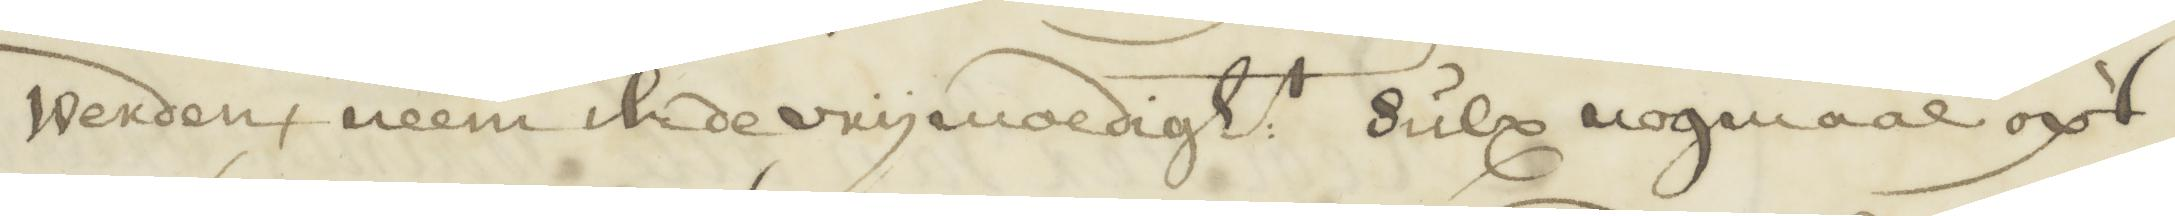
werden, neem ik de vrijmoedigh:t sulx nogmaal op ’t
